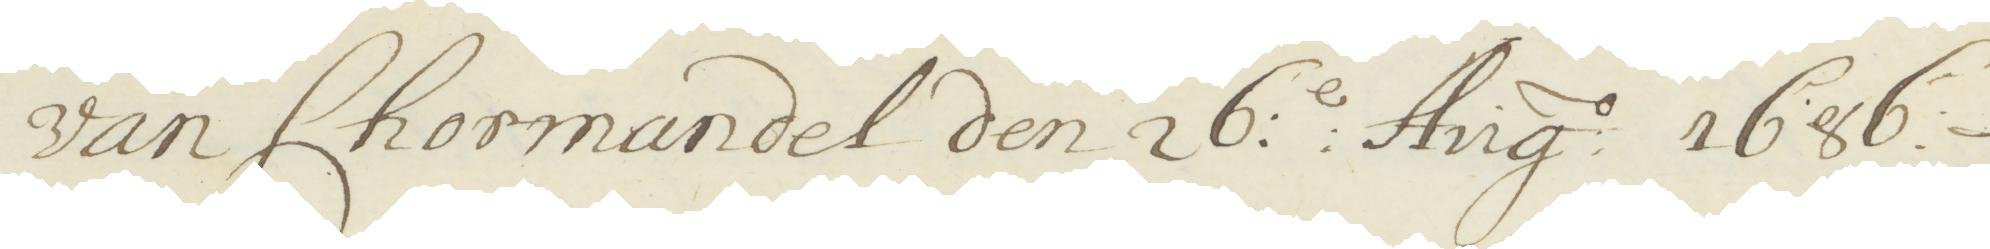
Van Chormandel den 26:e: Aug:o 1686:—
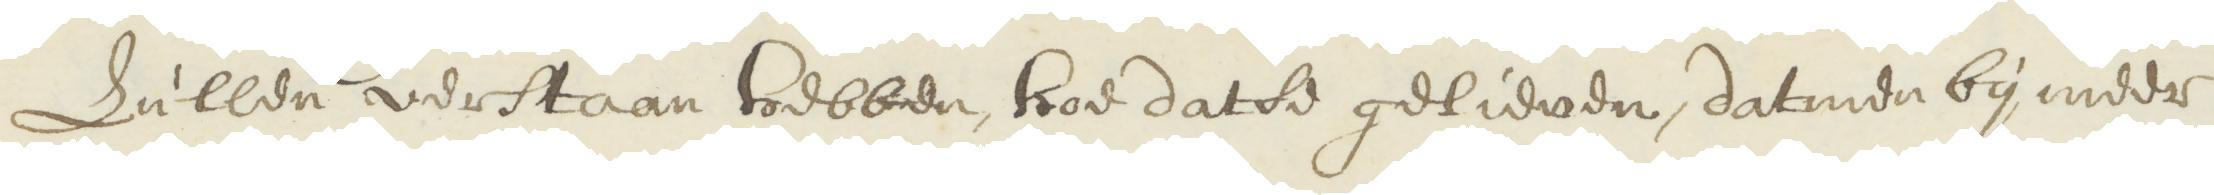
zullen verstaan hebben, hoe datse gelieven, dat men bij meer
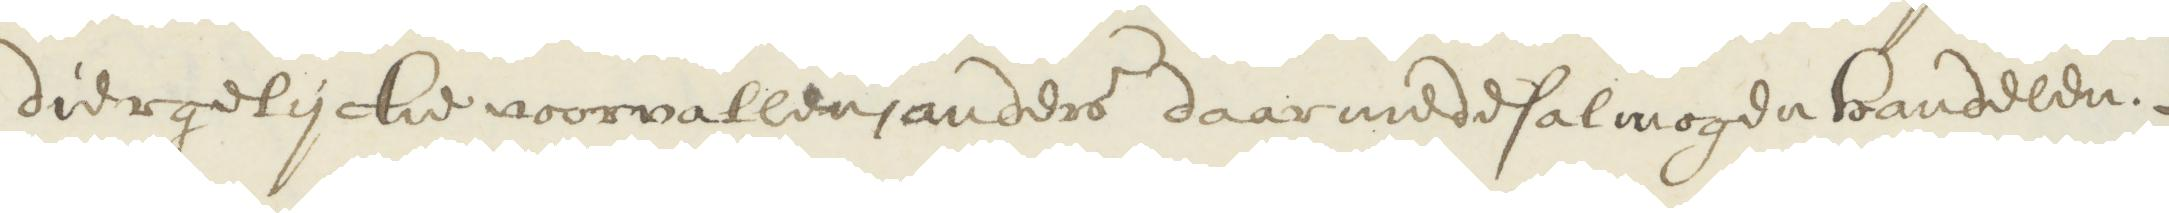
diergelijcke voorvallen, anders daar mede sal mogen handelen.
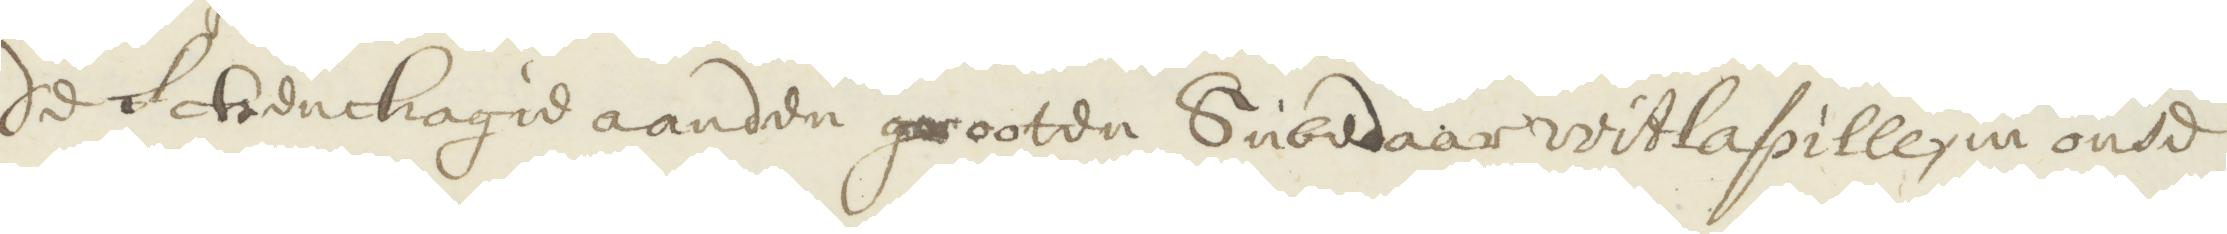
de schenckagie aanden grooten Subedaar witlapilley in onse
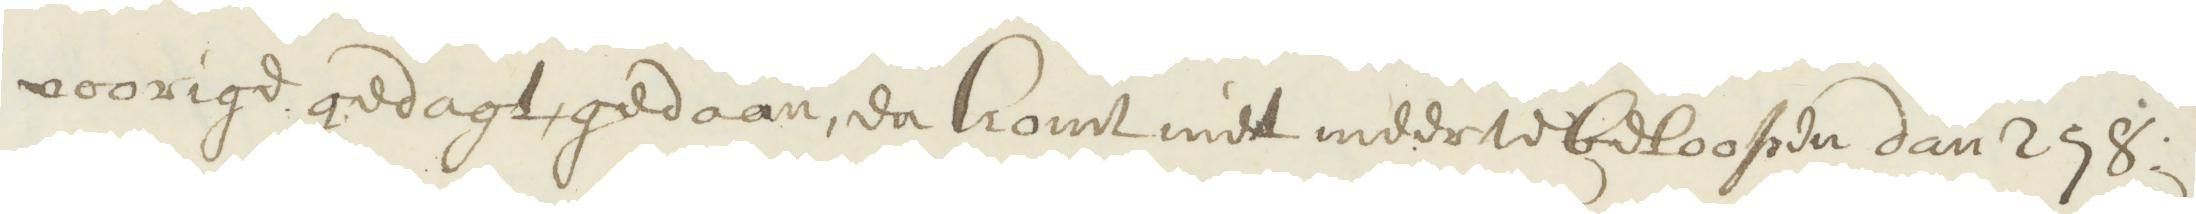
voorige gedagt, gedaan, en komt niet meer te beloopen dan 298:
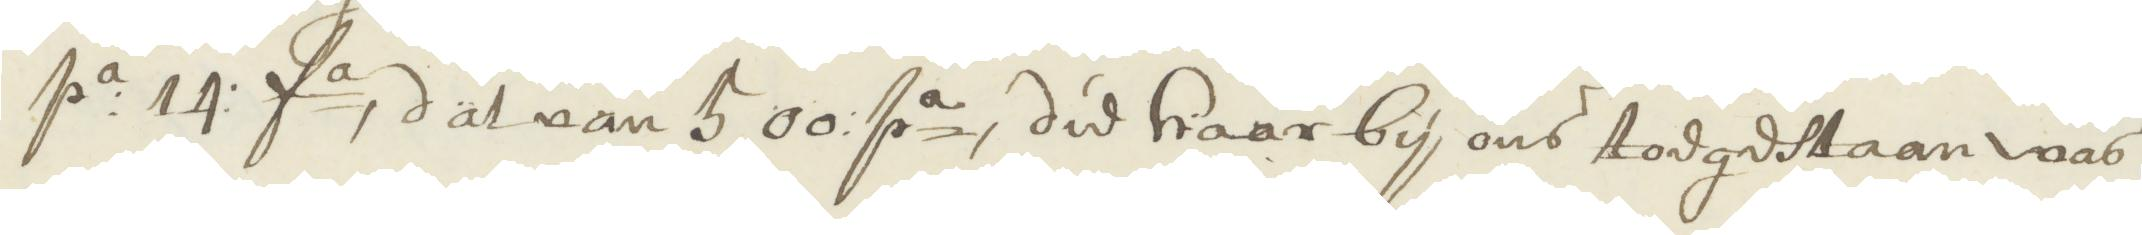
p:a 14: f=a, dat van 5 00: p=a, die haar bij ons toegestaan was
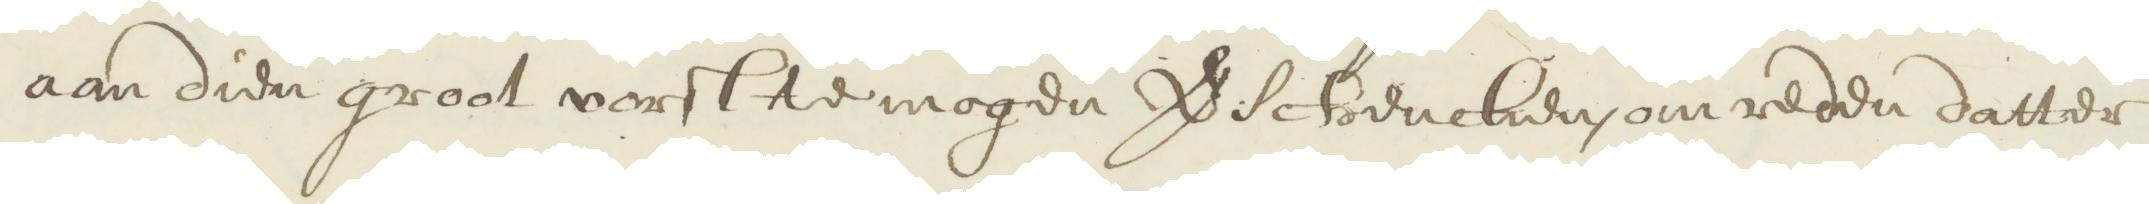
aan dien groot vorst te mogen verschencken, om reden datter
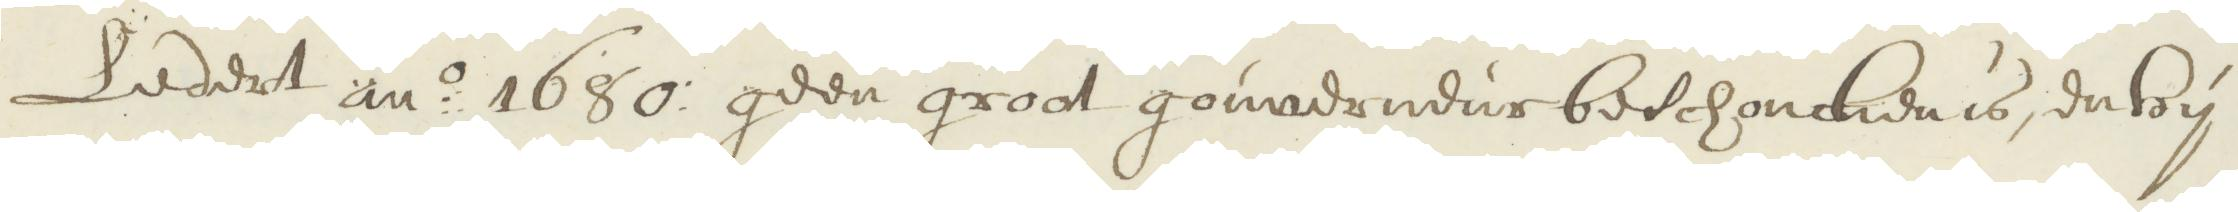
zedert an:o 1680: geen groot gouverneur beschoncken is, en hij
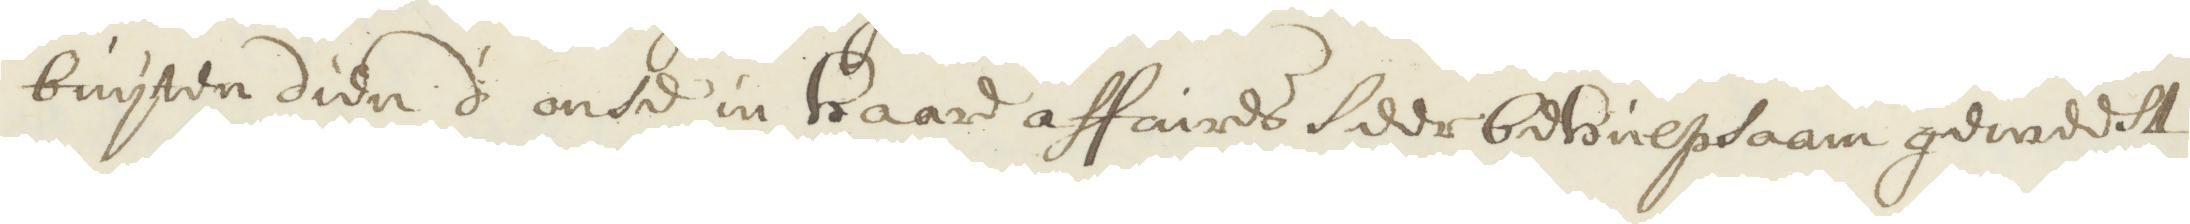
buijten dien d’ onse in haare affaires seer behulpsaam geweest
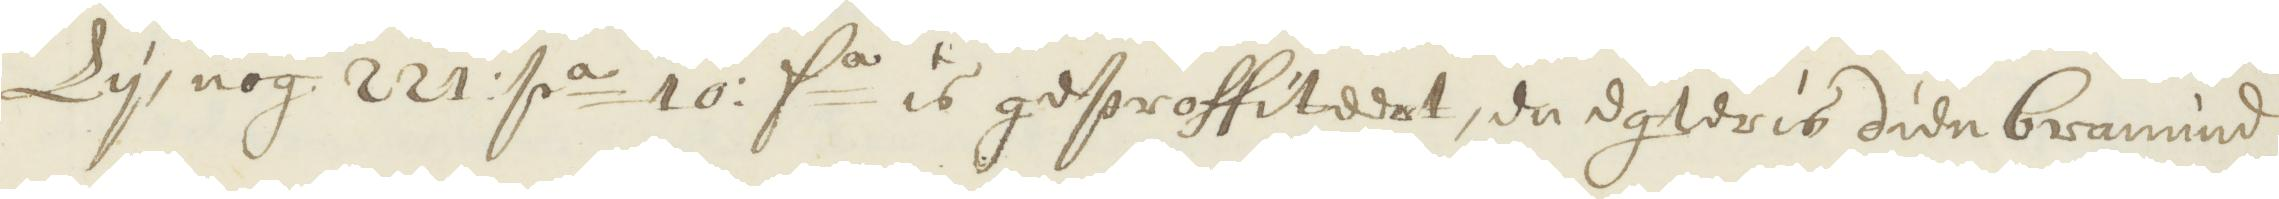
zij, nog 221: p=a 10: f=a is geproffiteert, en egter is dien bramind
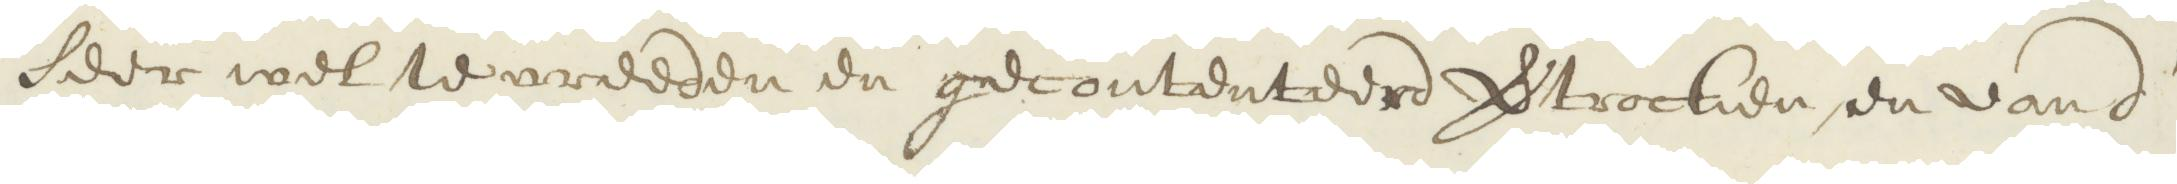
seer wel te vreeden en gecontenteerd vertrocken, en van d'
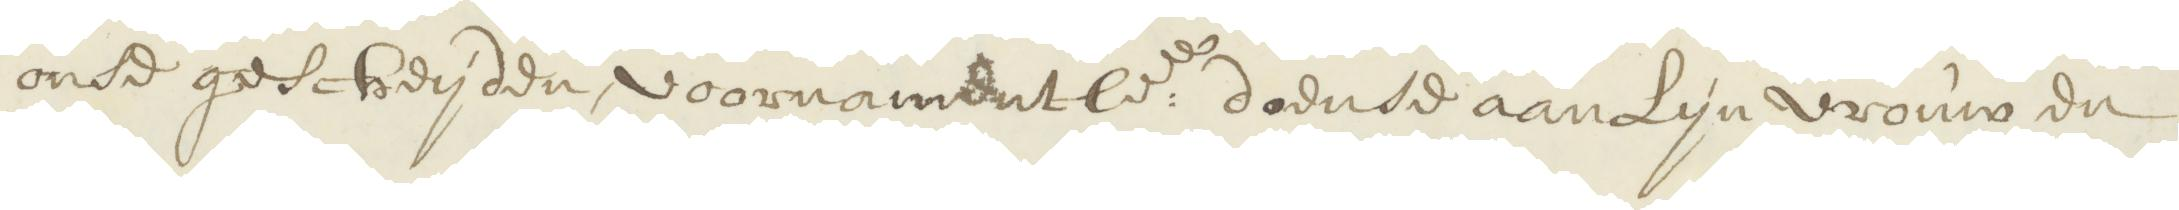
onse gescheijden, voornamentlijk: doense aan zijn vrouw en
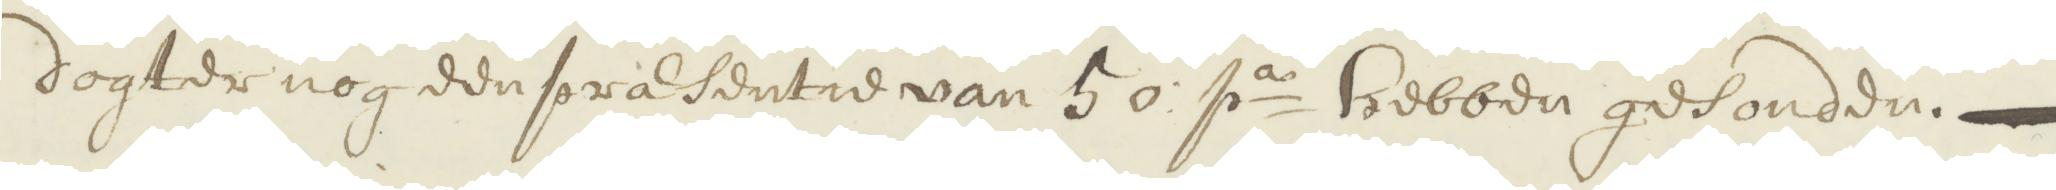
dogter nog een praesentie van 50: p=a hebben gesonden.—
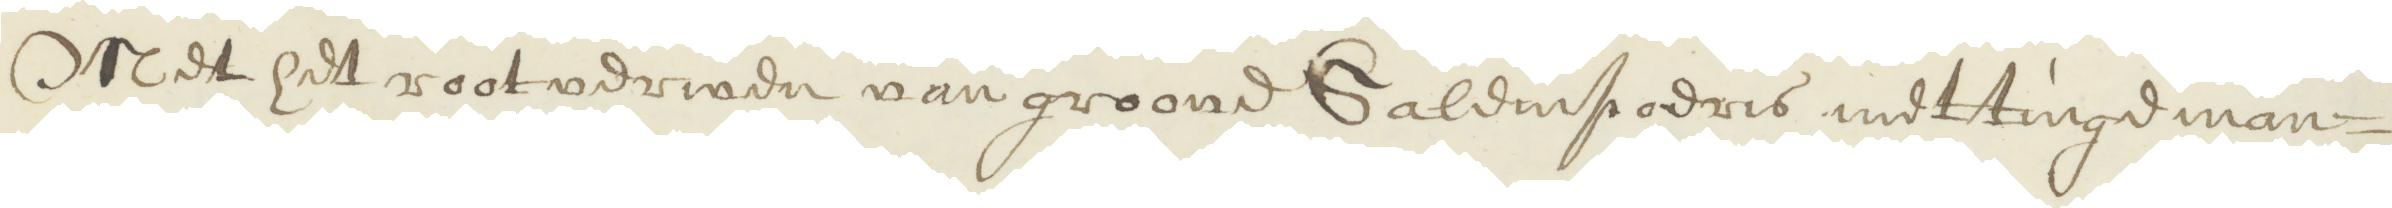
Met het rootverwen van groone Salempoeris met tinge man=
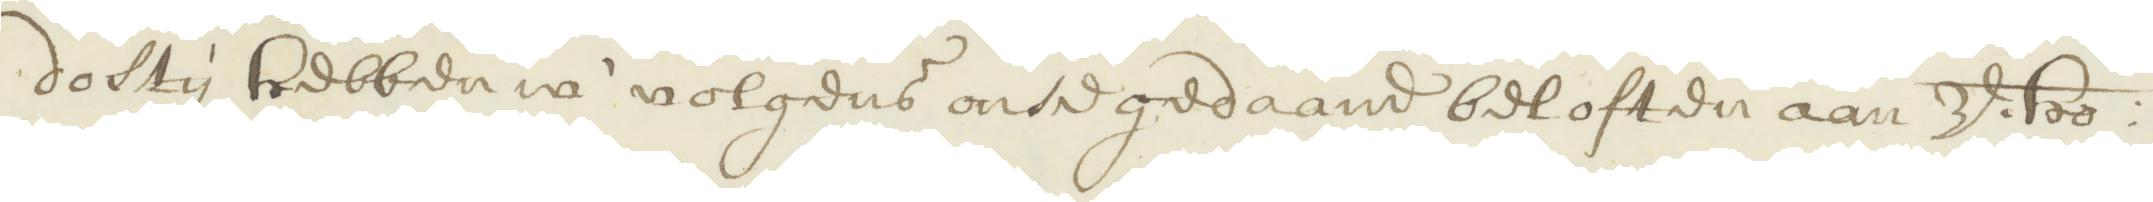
dostij hebben w' volgens onse gedaane beloften aan V. ho:
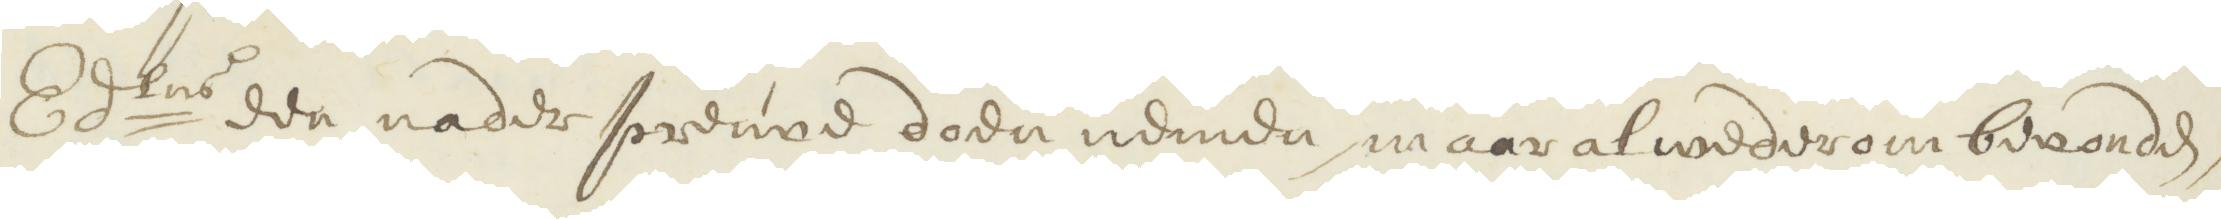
Ed=lns een nader preuve doen nemen maar al wederom bevonden,
